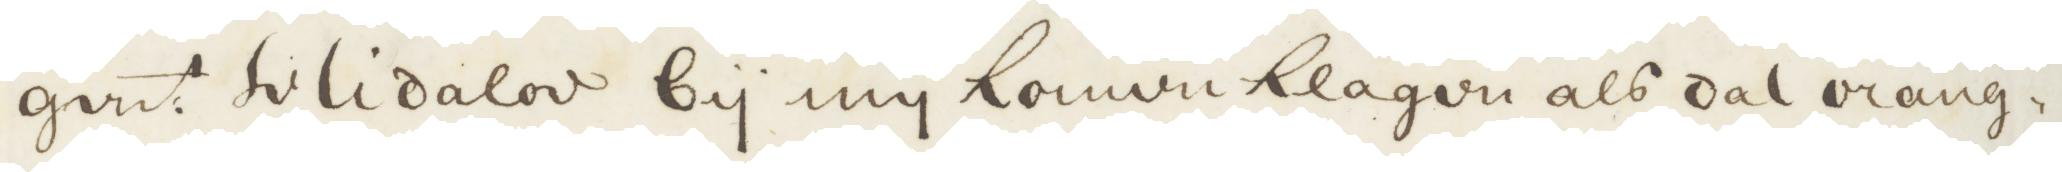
gen:t teti daloe bij mij komen klagen als dat orang„
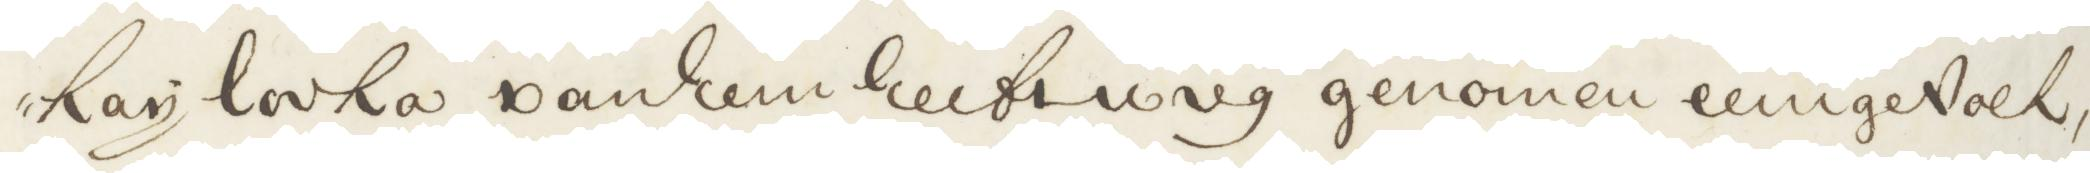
„kaij loeka van hem heeft weg genomen eenige volk
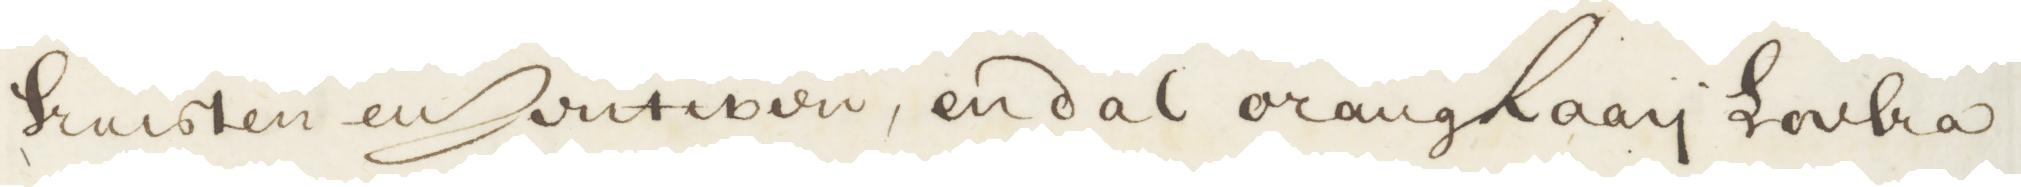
kristen en jentiven, en dat orangkaaij Loeka
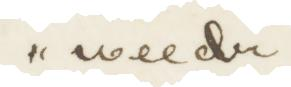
„weeder
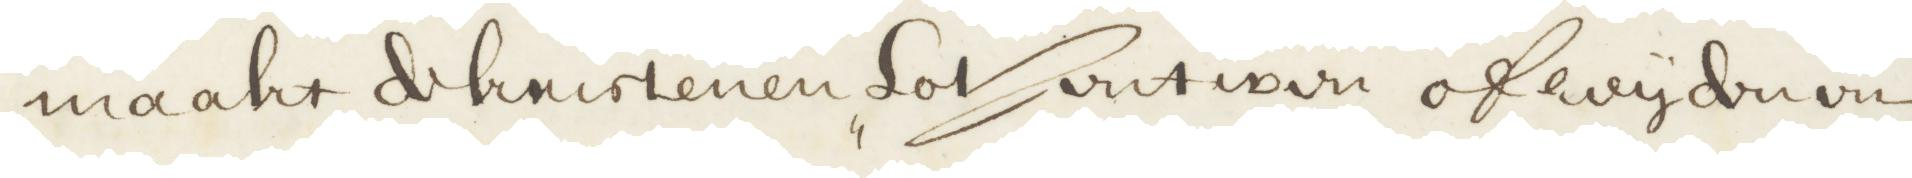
maakt de kristenen „ tot jentiven of heijdenen
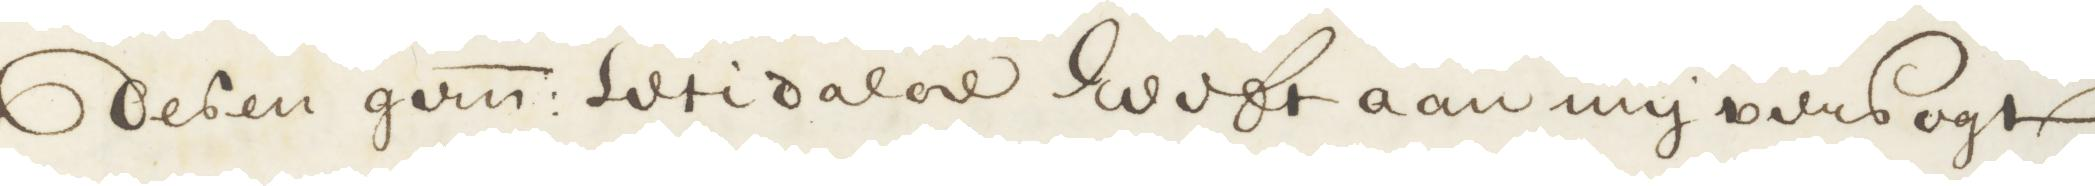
desen gem: teti daloe heeft aan mij versogt
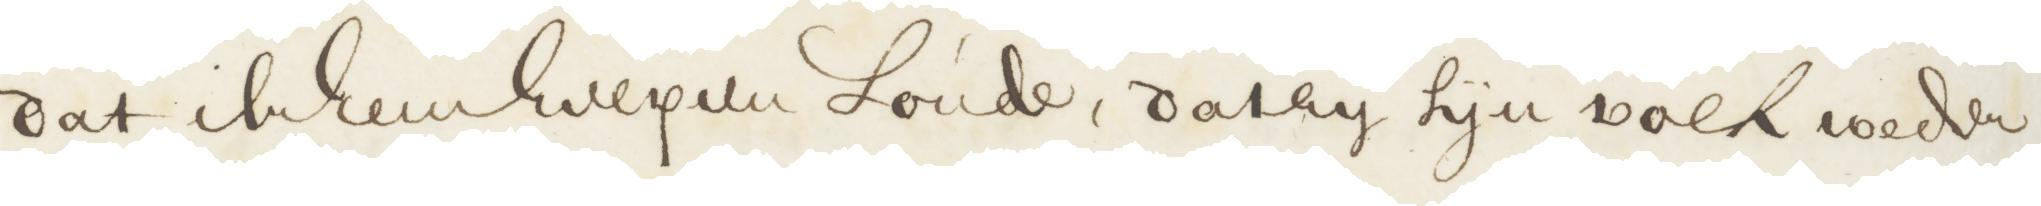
dat ik hem helpen soude, dat hij sijn volk weder
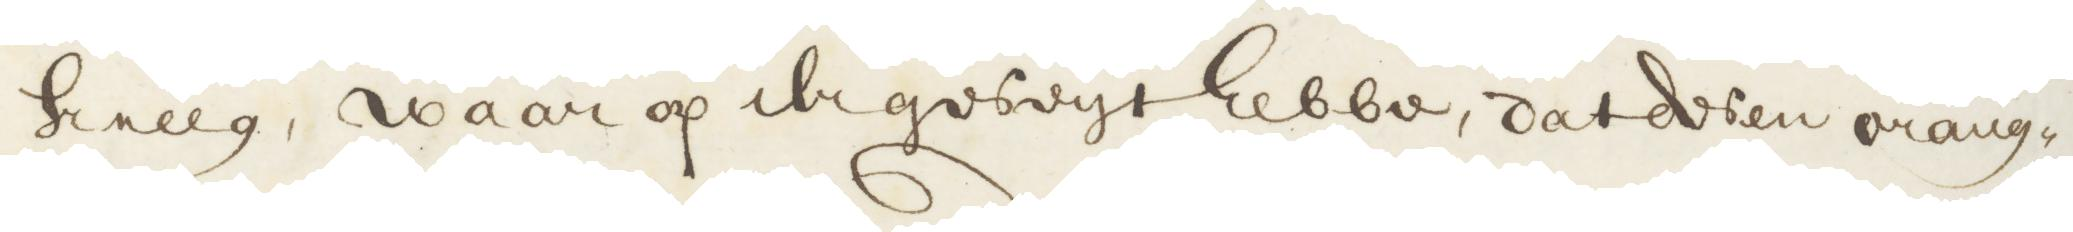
kreeg, waar op ik geseijt hebbe, dat desen orang„
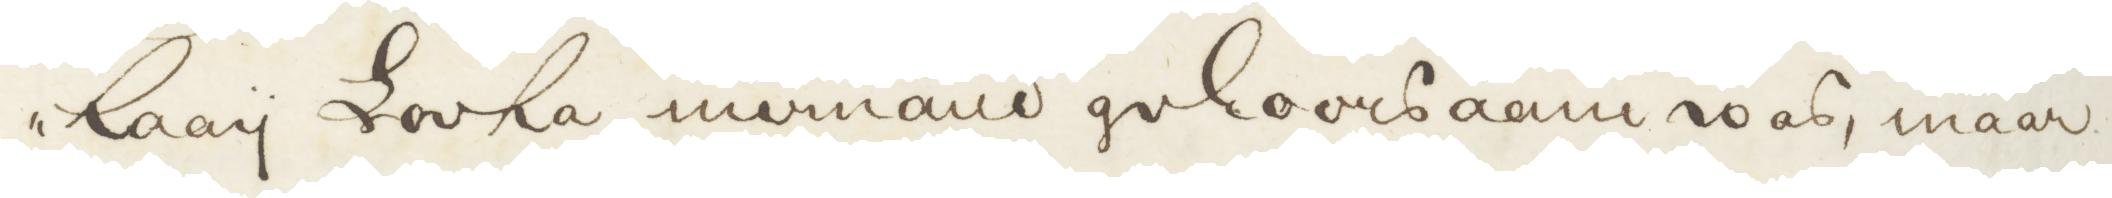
„kaaij Loeka niemand gehoorsaam was, maar
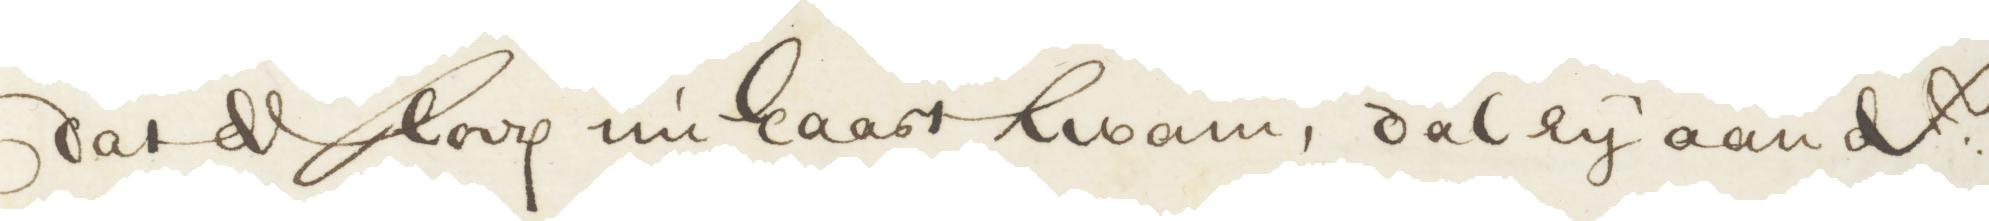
dat de sloep nu haast kwam, dat hij aan d'E:
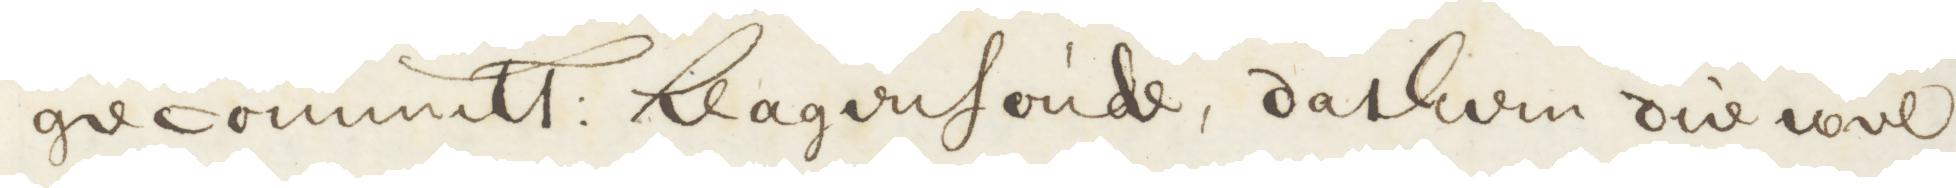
gecommitt: klagen soude, dat hem die wel
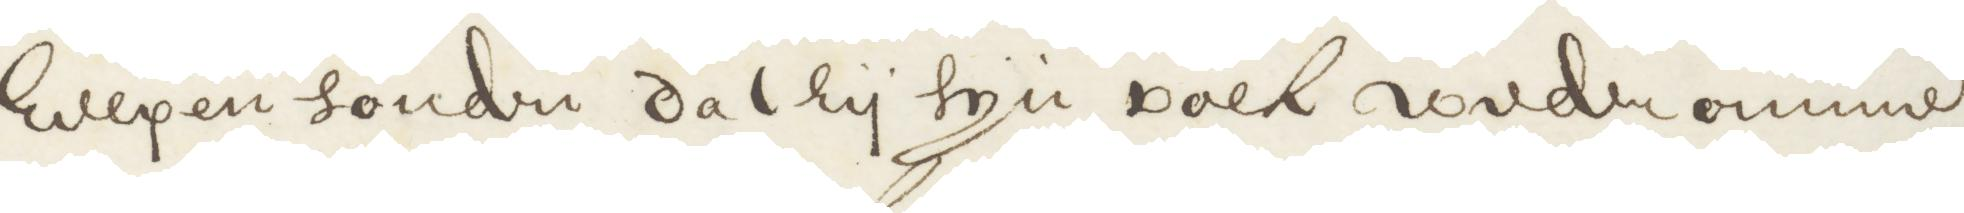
helpen souden dat hij sijn volk weder omme
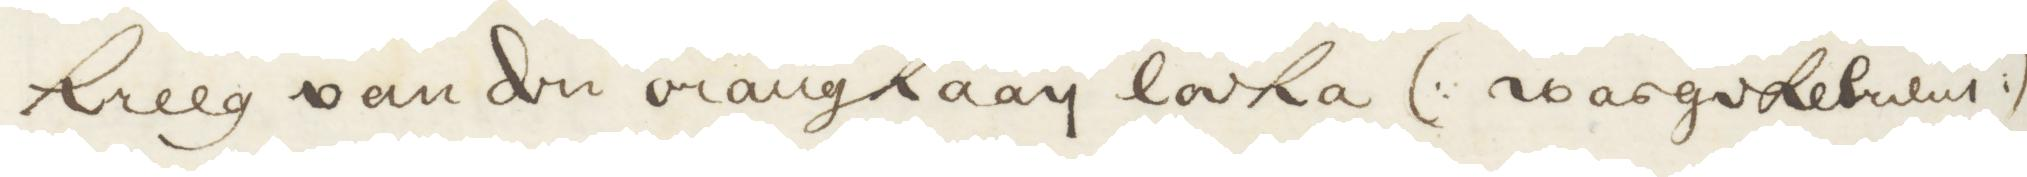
kreeg van den orangzaaij loeka (:was getekent:
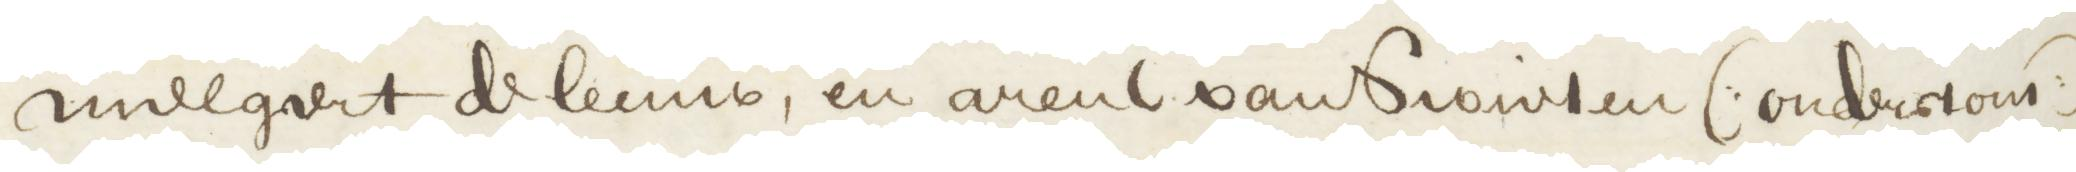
melgert de leeuw, en arent van swieten (:onderstont
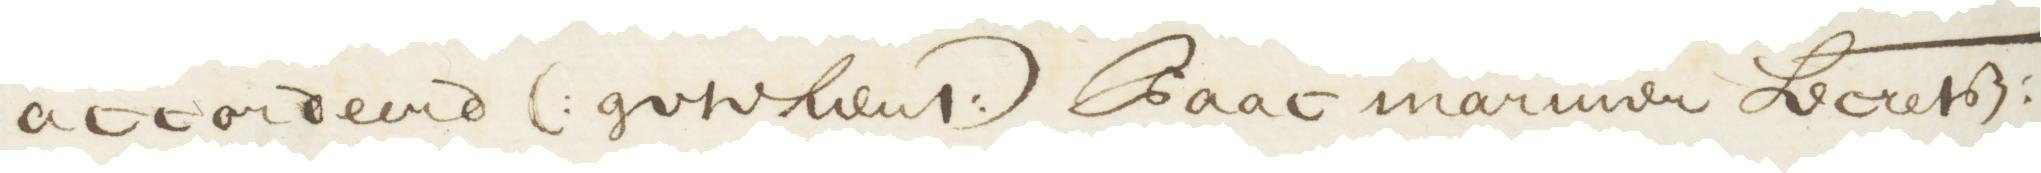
accordeerd (:getekent:) Isaac marmer secretsz
